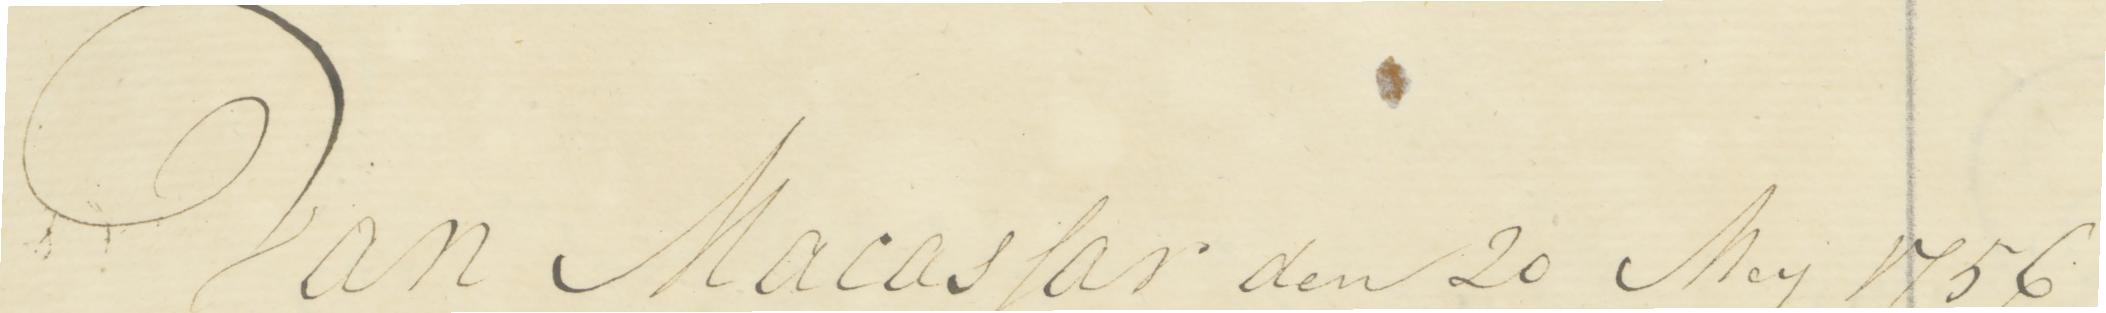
Van Macassar den 20 Mey 1756
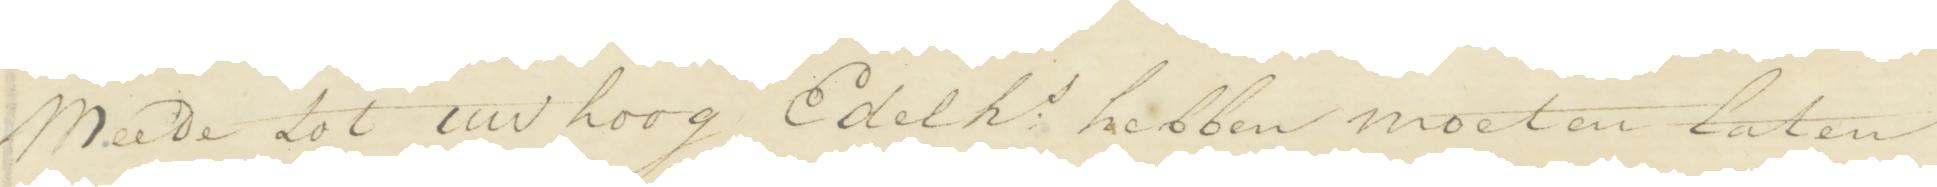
Meede tot uw hoog Edelh:s hebben moeten laten
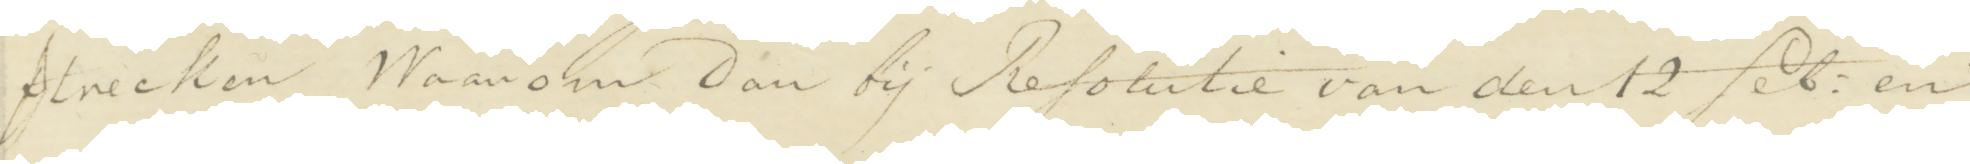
vertrecken Waarom dan bij Resolutie van den 12 feb: en
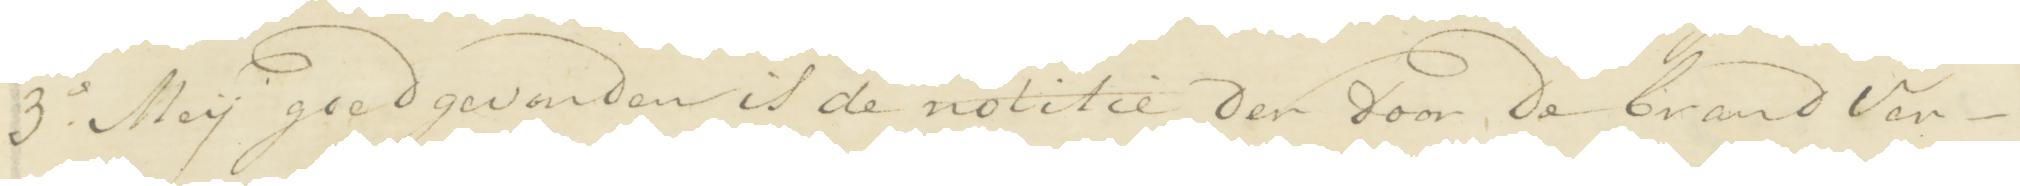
3:e Meij goed gevonden is de notitie der door de brand Ver
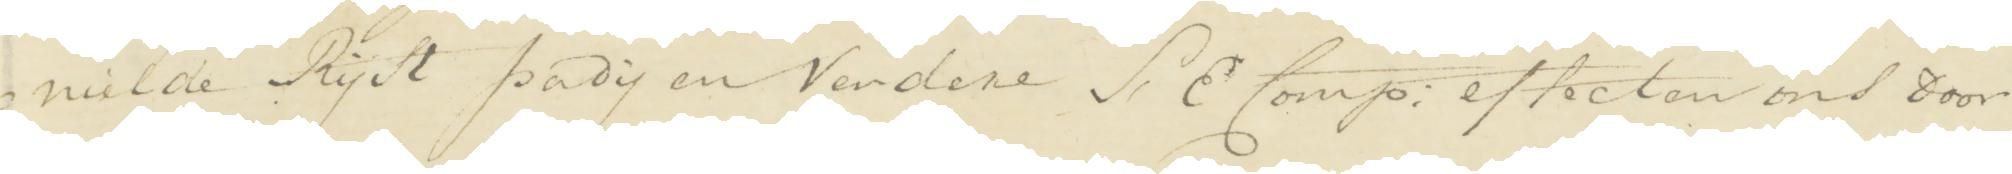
, nielde Rijst padij en verdere s' E Comp: effecten ons door
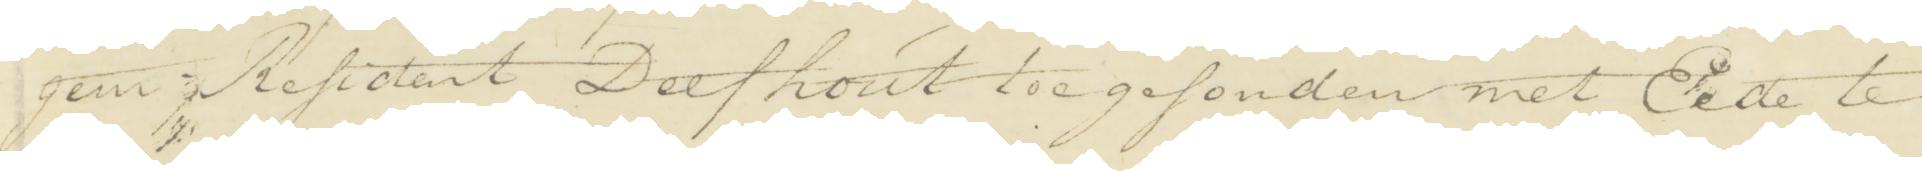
gem: Resident Delfhout toegesonden met Eede te
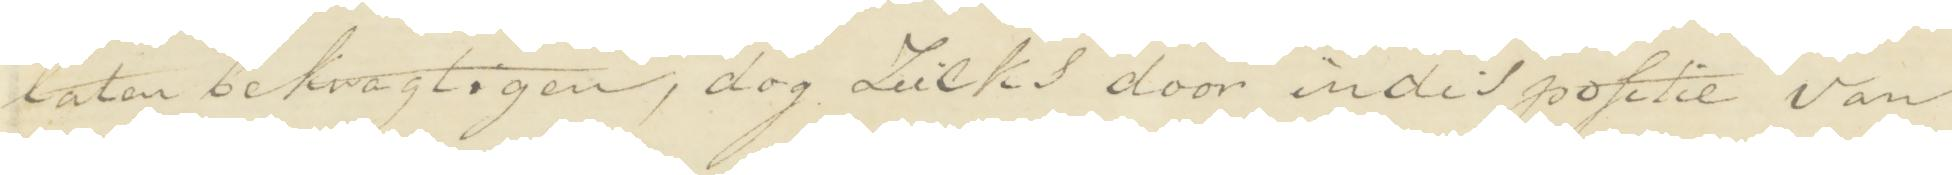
laten bekragtigen, dog zulks door indispositie van
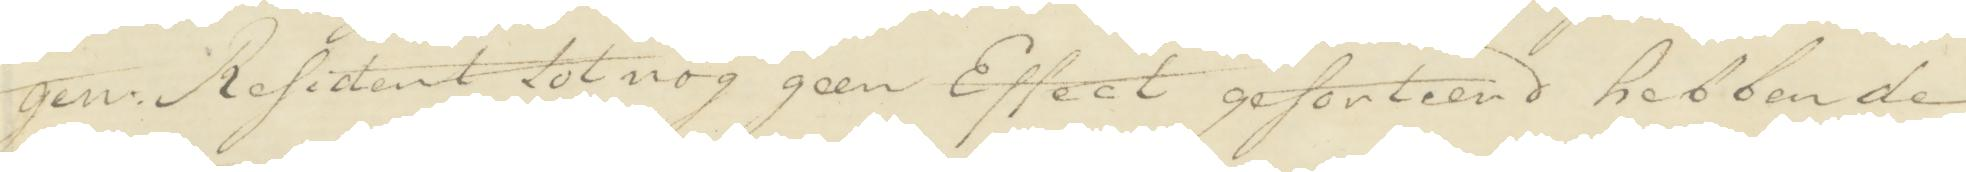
gen: Resident tot nog geen Effect gesorteerd hebbende,
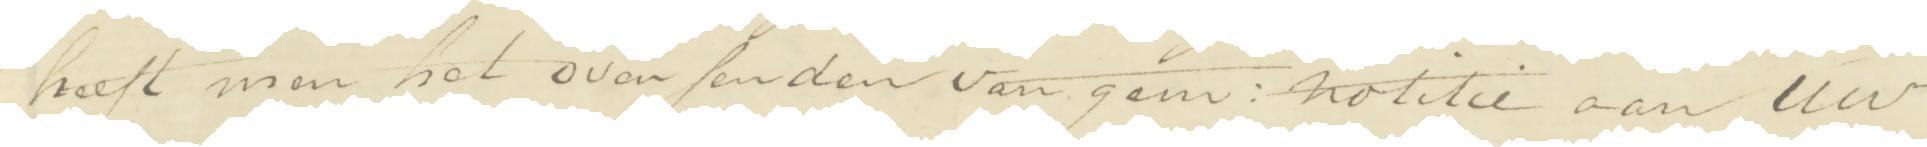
heeft men het over senden van gem: notitie aan uw
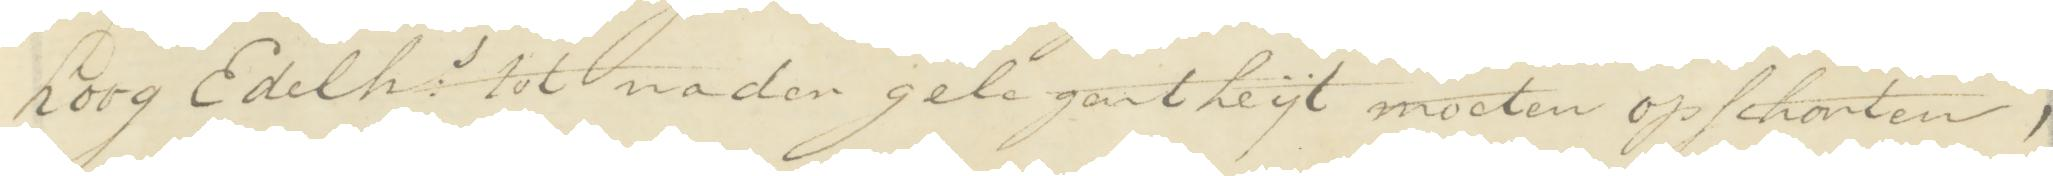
hoog Edelh:s tot nader gelegentheijt moeten opschorten,
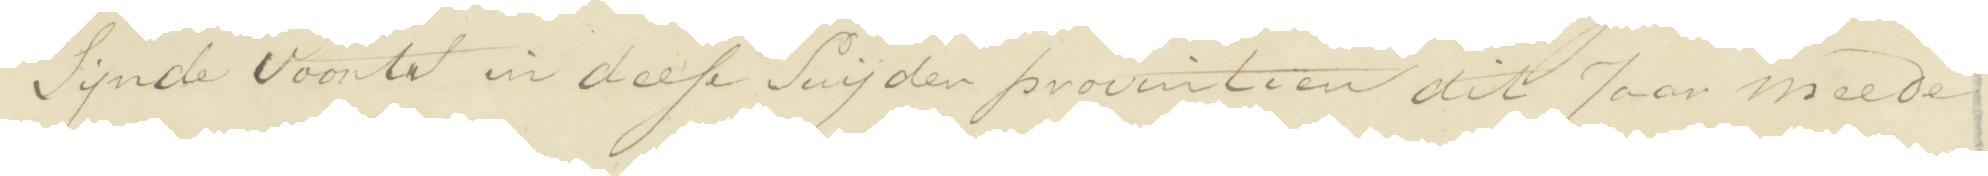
sijnde voorts in deese suijder provintien dit Jaar meede
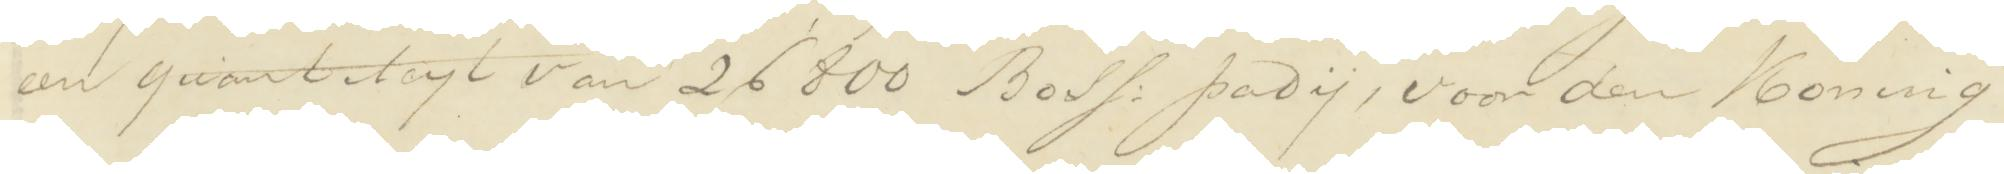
een quantiteijt van 26800 Boss: padij, voor den Koning
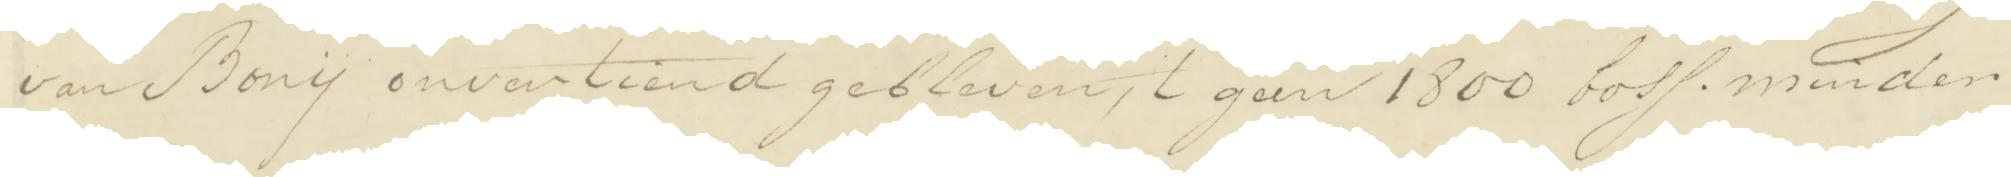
van Bonij onvertiend gebleven, 't geen 1800 boss. minder
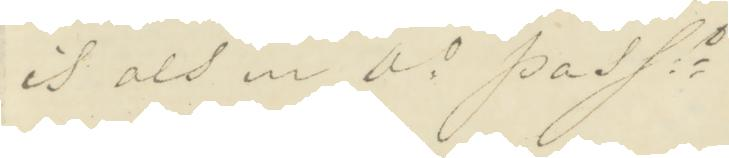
is als in a:o pass:=o
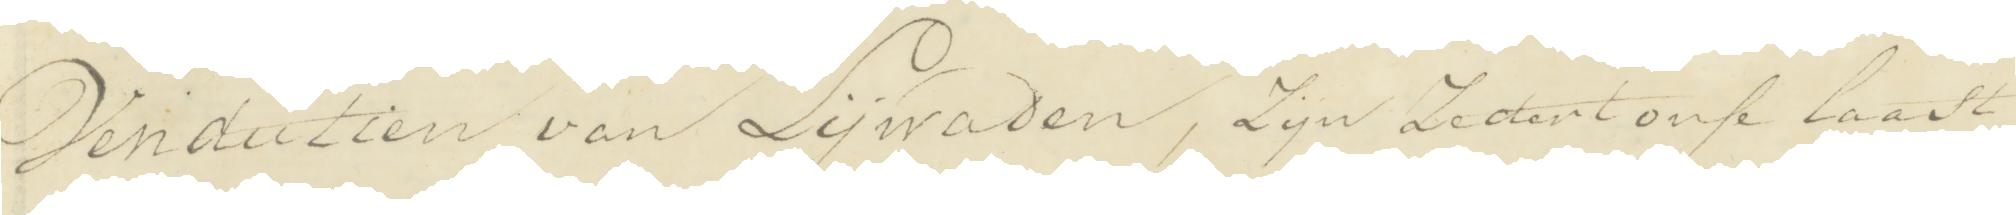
Vendutien van Lijwaden, zijn zedert onse laast
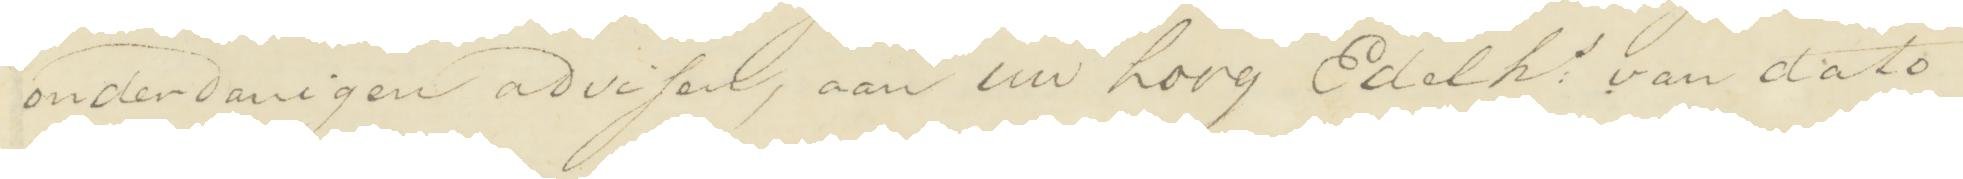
onderdanigen advisen, aan uw hoog Edelh:s van dato
